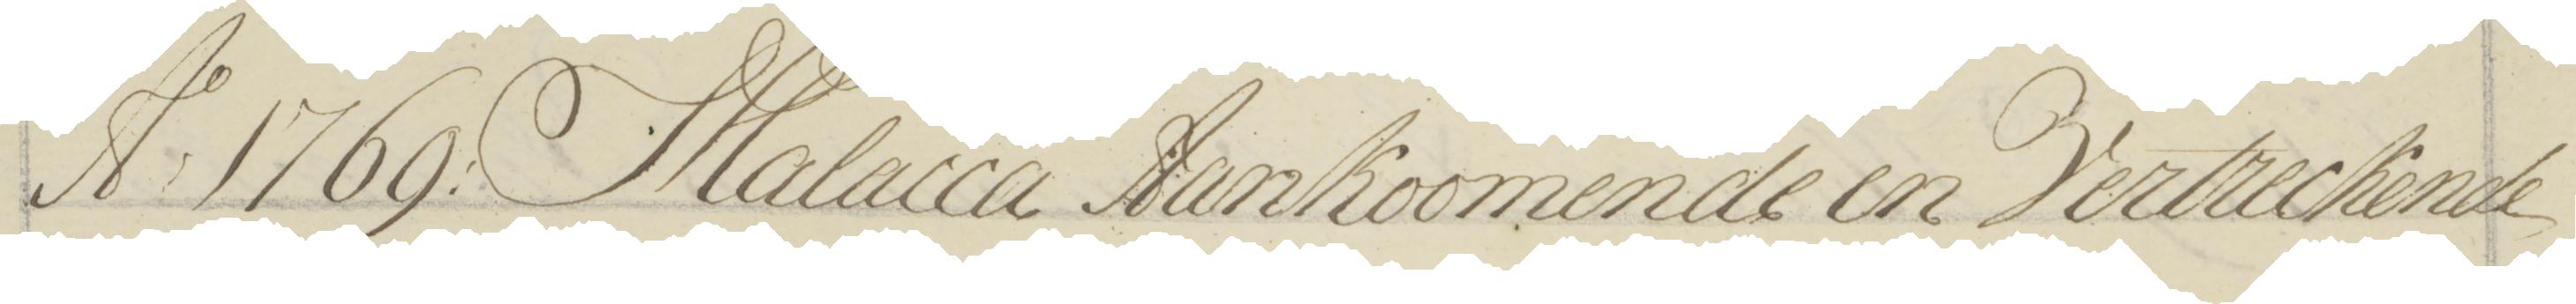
A„o 1769: Malacca Aankoomende en Vertreckende
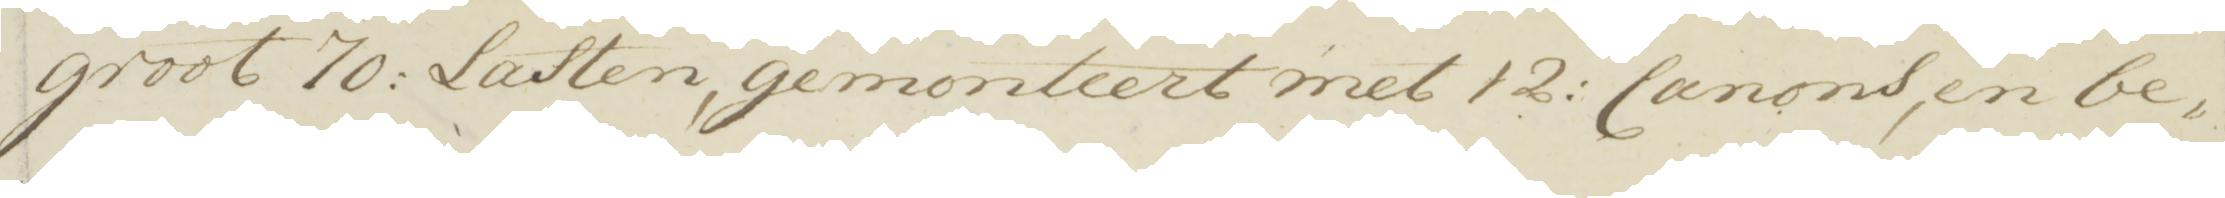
groot 70: Lasten, gemonteert met 12: Canons, en be„
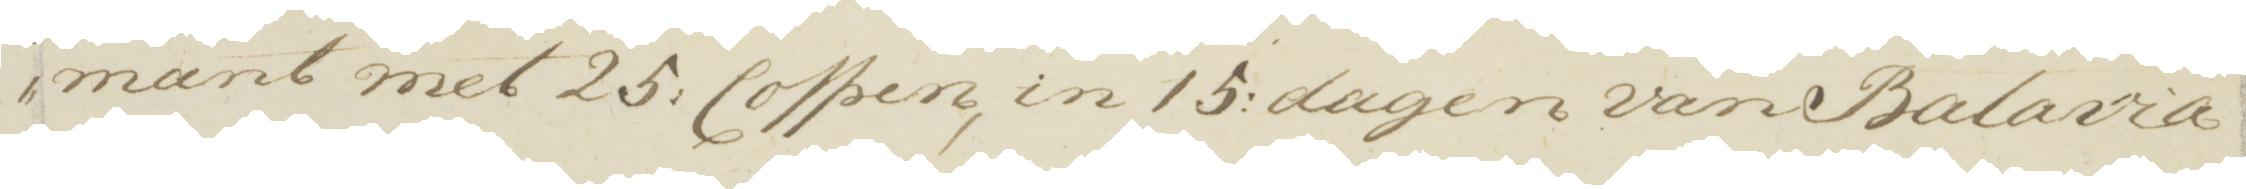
„mant met 25: Coppen, in 15: dagen van Batavia
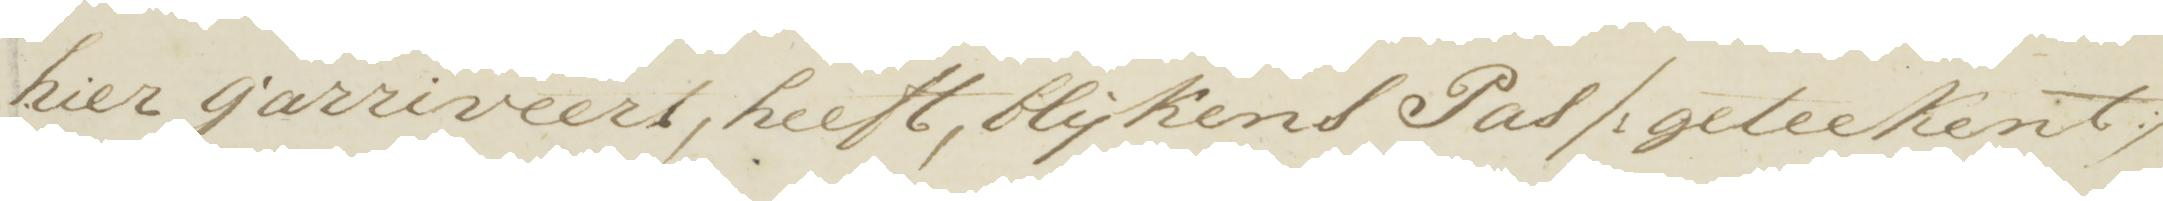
hier g'arriveert, heeft, blijkens Pas /:geteekent:/
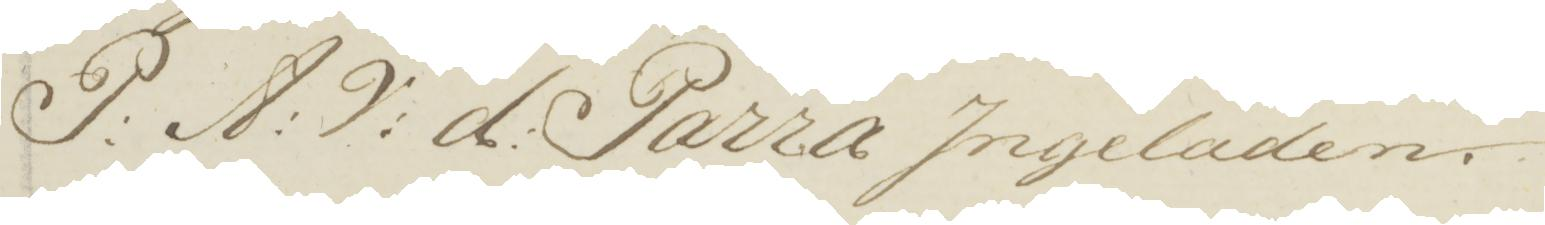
P: A: v: d: Parra Jngeladen.
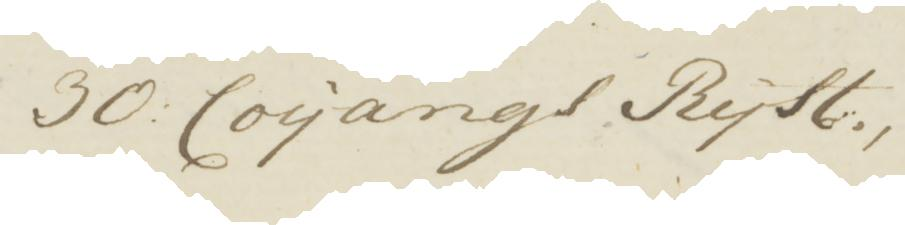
30: Coijangs Rijst,
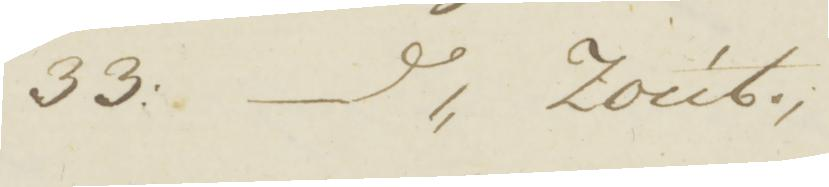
33. _„o Zout.,
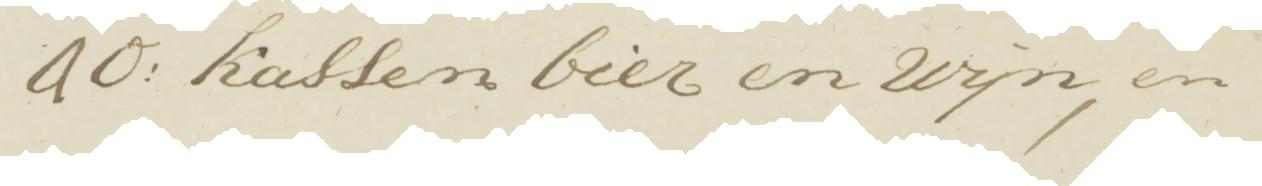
40: kassen bier en wijn, en
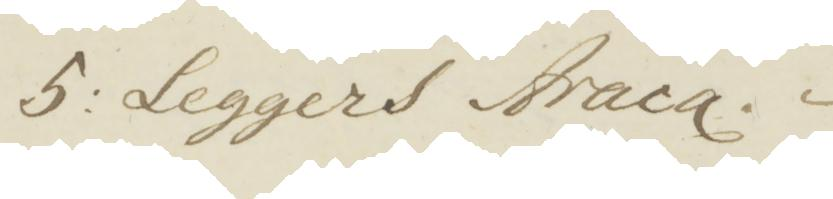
5: Leggers Aracq.
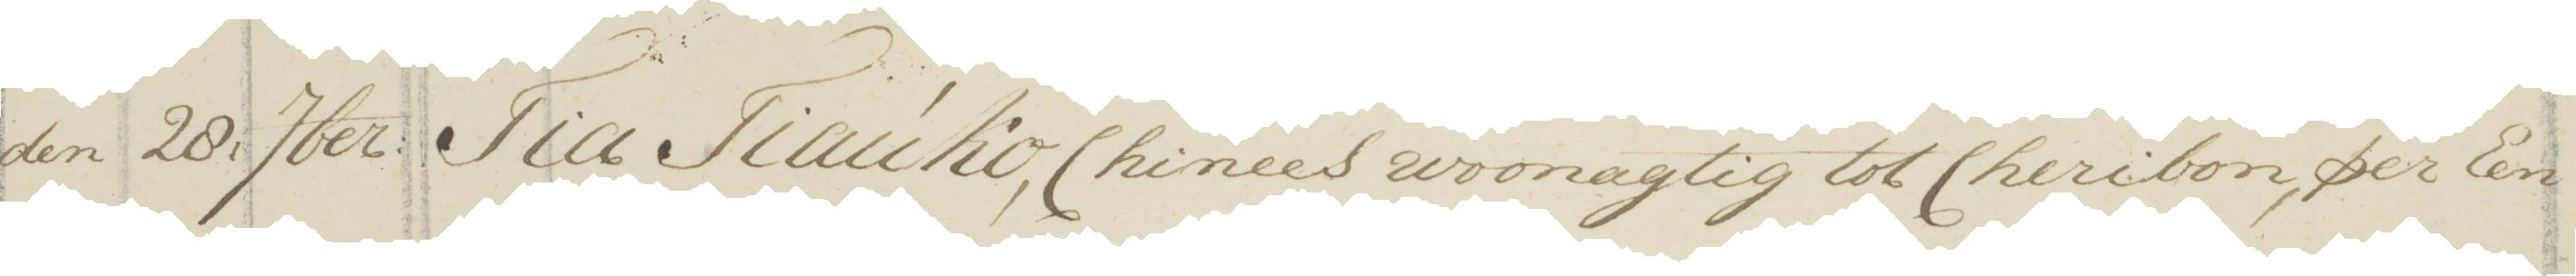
den 28: 7ber: Tia Tiauko, Chinees woonagtig tot Cheribon, per Een
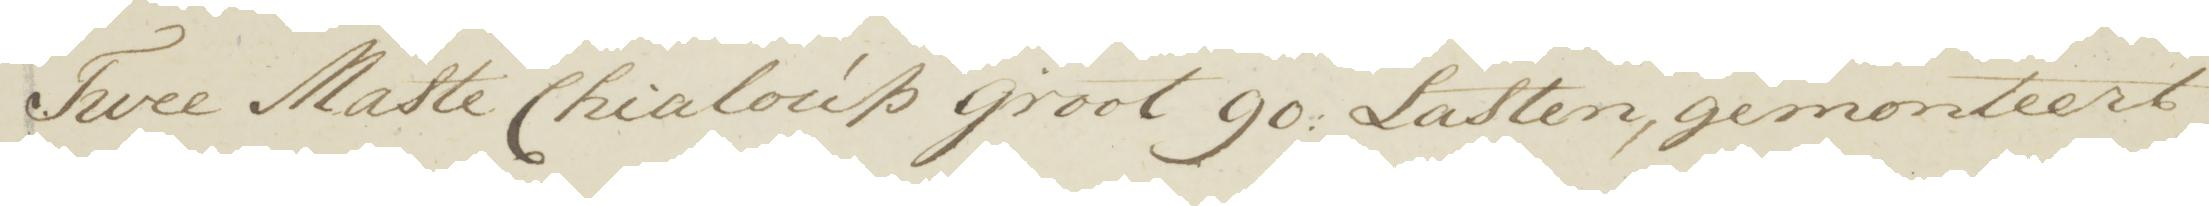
Twee Maste Chialoup groot 90: Lasten, gemonteert
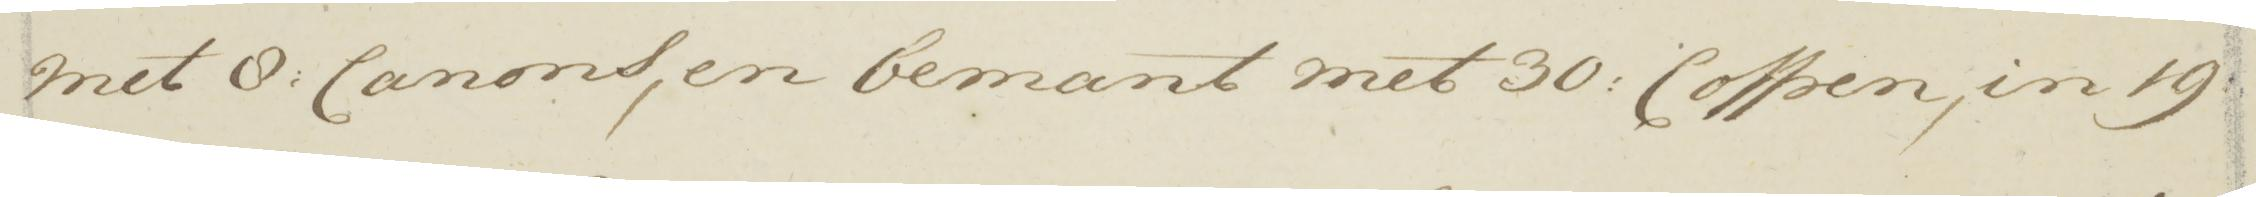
met 8: Canons, en bemant met 30: Coppen, in 19:
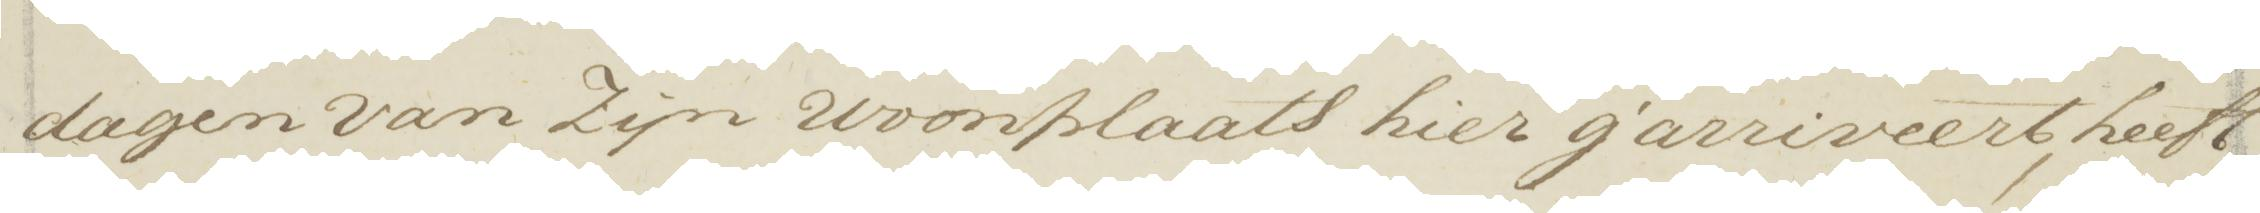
dagen van zijn woonplaats hier g'arriveert, heeft
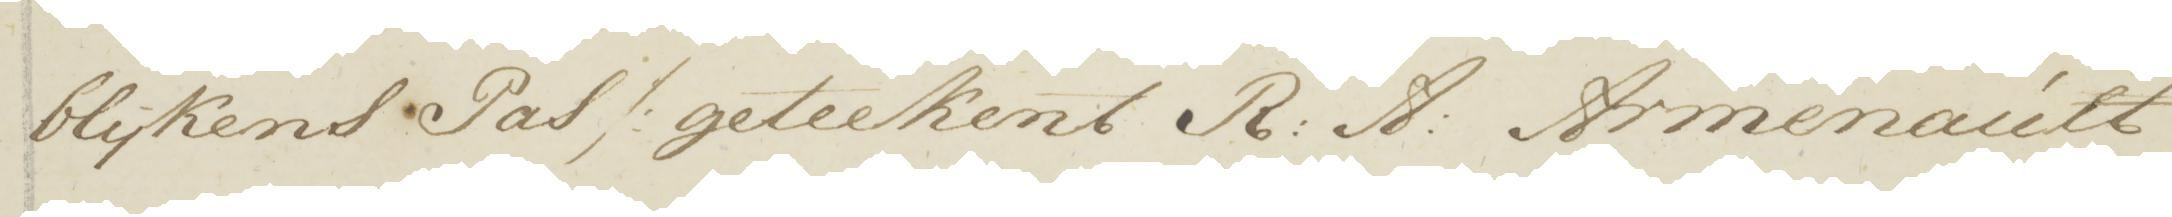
blijkens Pas /:geteekent R: A: Armenault
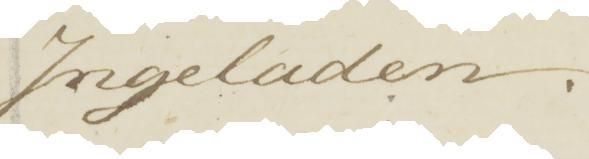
Jngeladen.
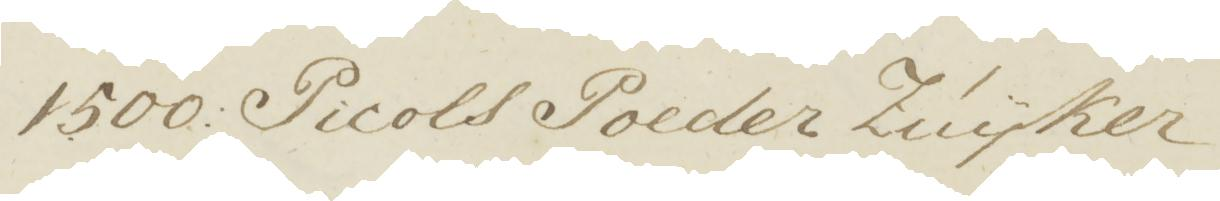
1500: Picols Poeder zuijker
